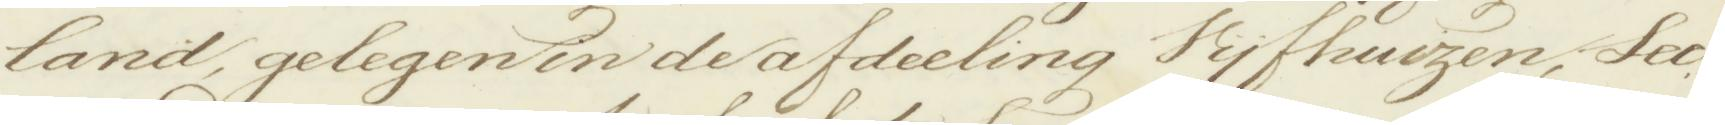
land, gelegen in de afdeeling Vijfhuizen, Sec„
